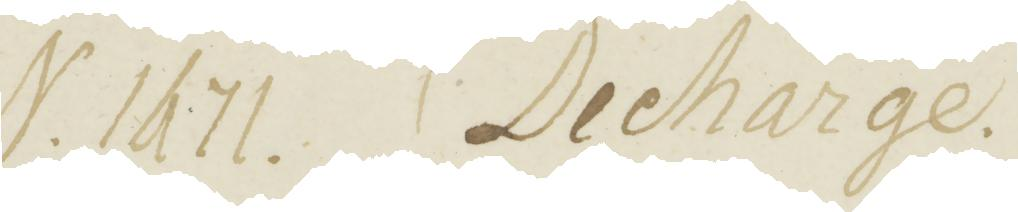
N. 1471. Decharge.
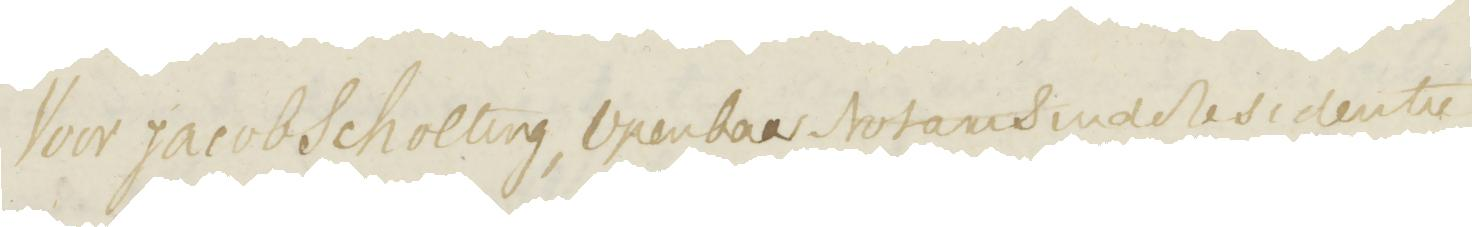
Voor Jacob Scholting, Openbaar Notaris in de Residentie
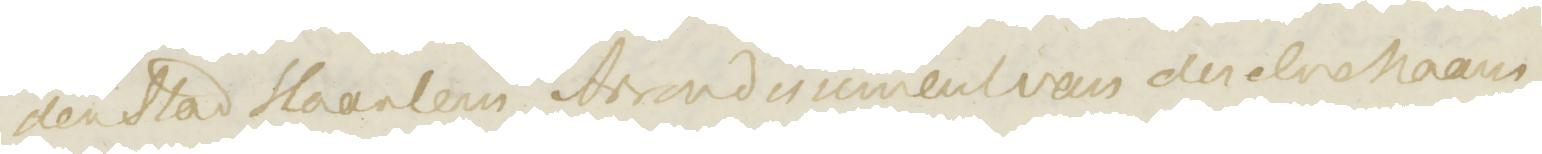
der Stad Haarlem, Arrondisement van dezelve naam
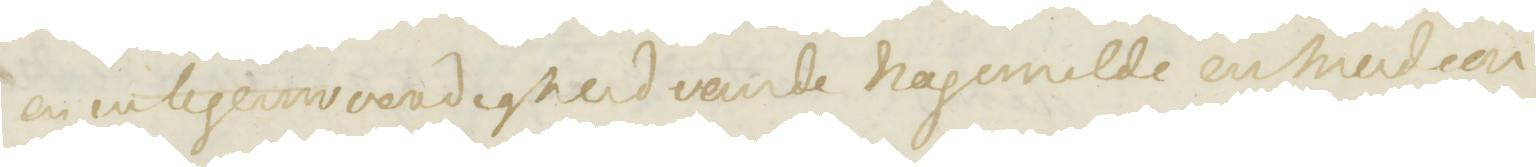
en in tegenwoordigheid vande nagemelde en mede on
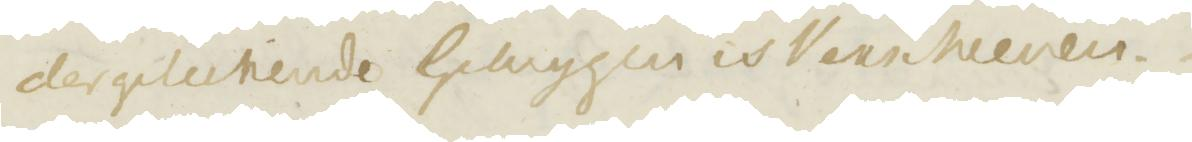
dergeteekende Getuygen is Verscheenen.
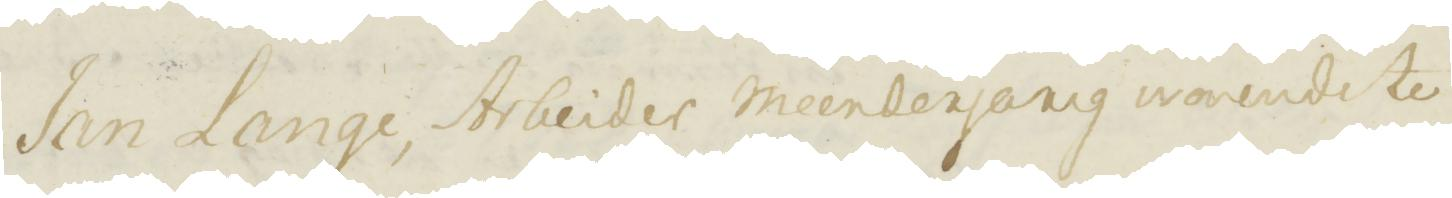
Jan Lange, Arbeider meerderjarig wonende te
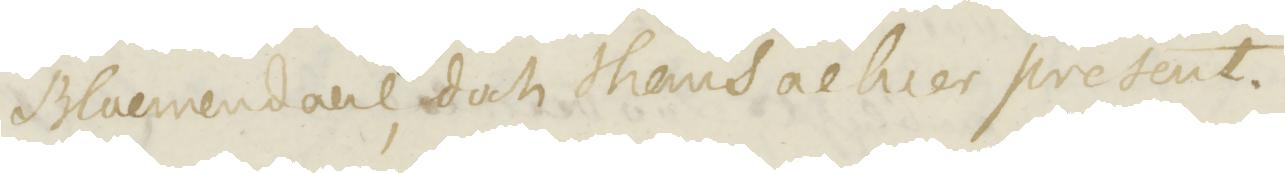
Bloemendaal, doch thans alhier present.
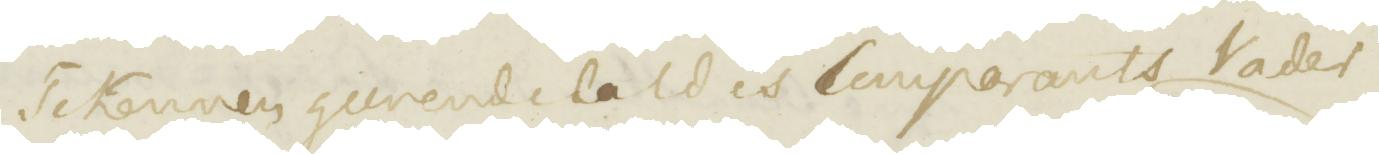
Te Kennen geevende dat des Comparants Vader
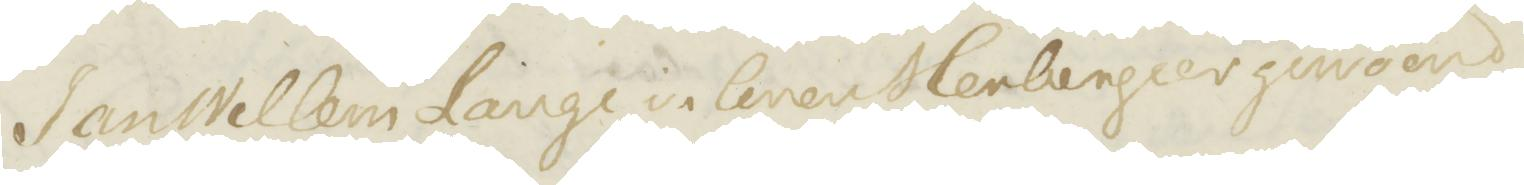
Jan Willem Lange in leven Herbergier gewoond
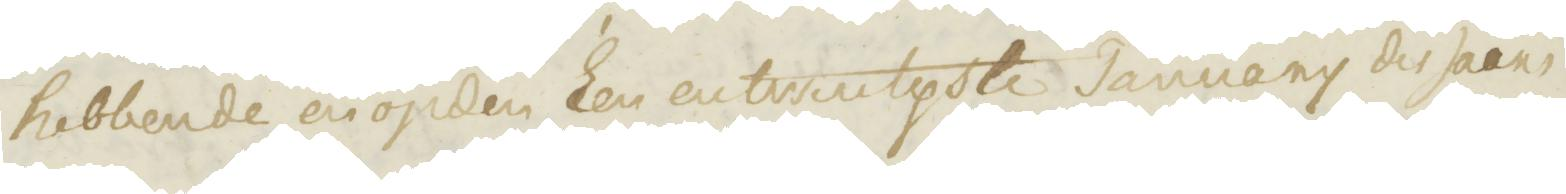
hebbende en op den Een en twintigste January des jaars
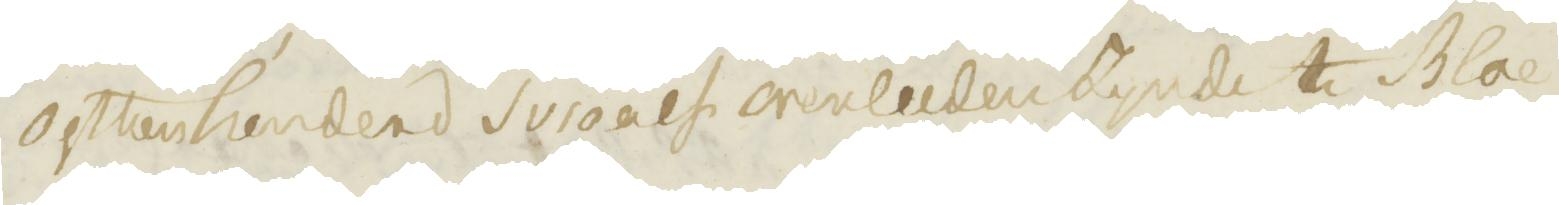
agttienhonderd Twaalf overleeden Zynde te Bloe
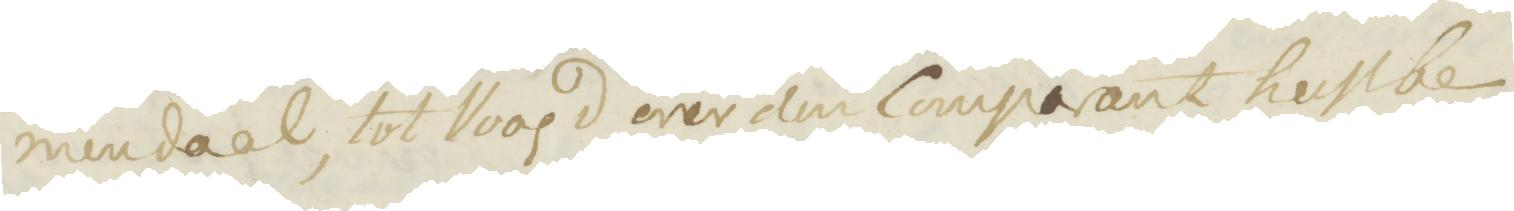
mendaal, tot Voogd over den Comparant heeft be
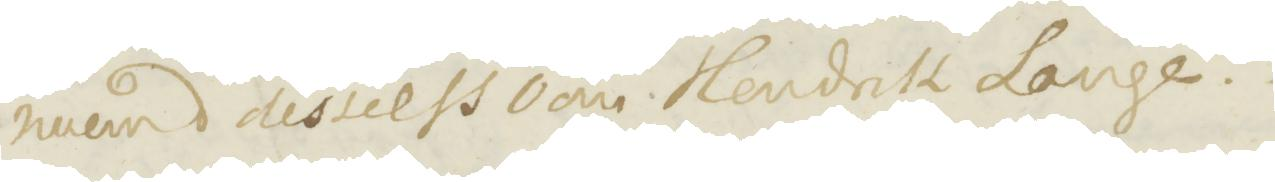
noemd deszelfs Oom Hendrik Lange.
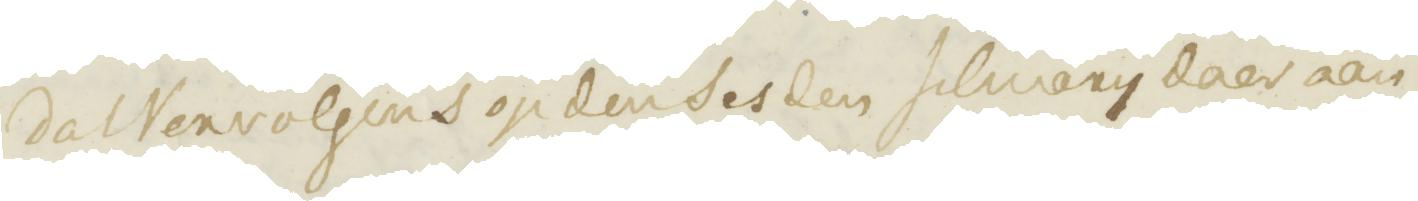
dat Vervolgens op den Sesden February daer aan
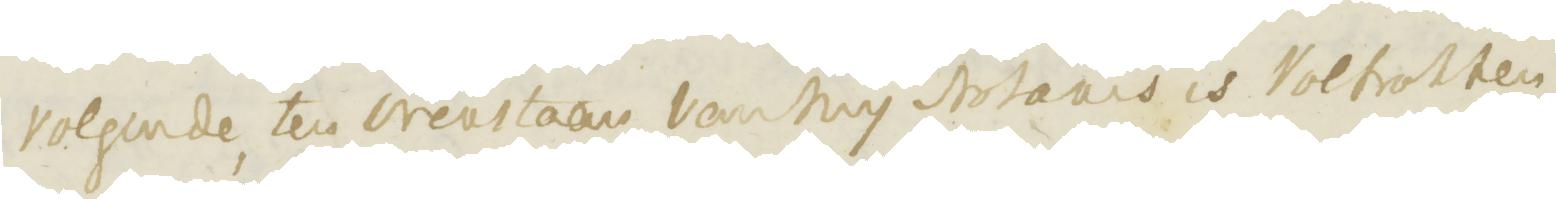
volgende, ten overstaan van my Notaris is Voltrokken
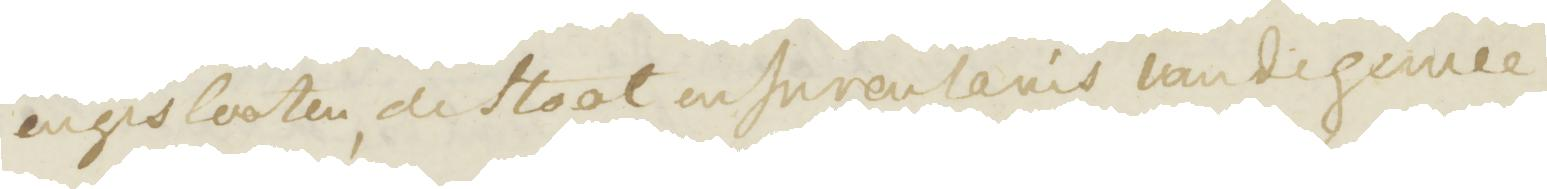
en geslooten, de Staat en Inventaris van de gemee
